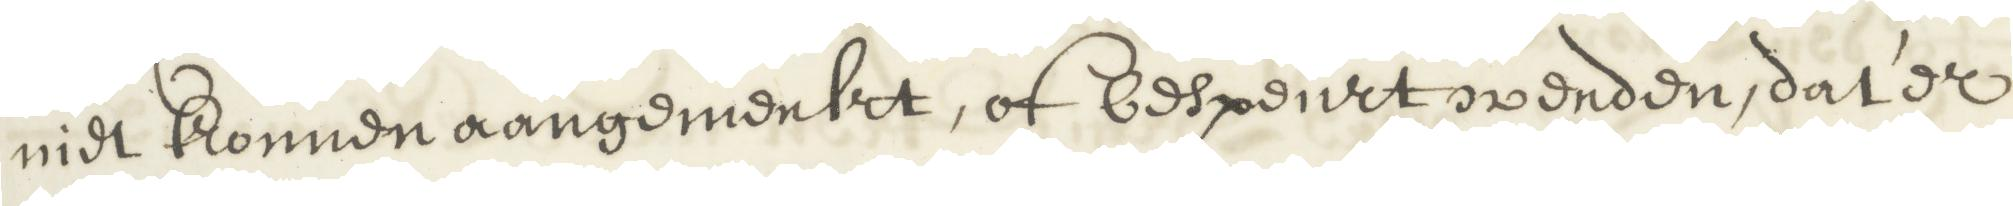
niet konnen aangemerkt, of bespeurt werden, dat 'er
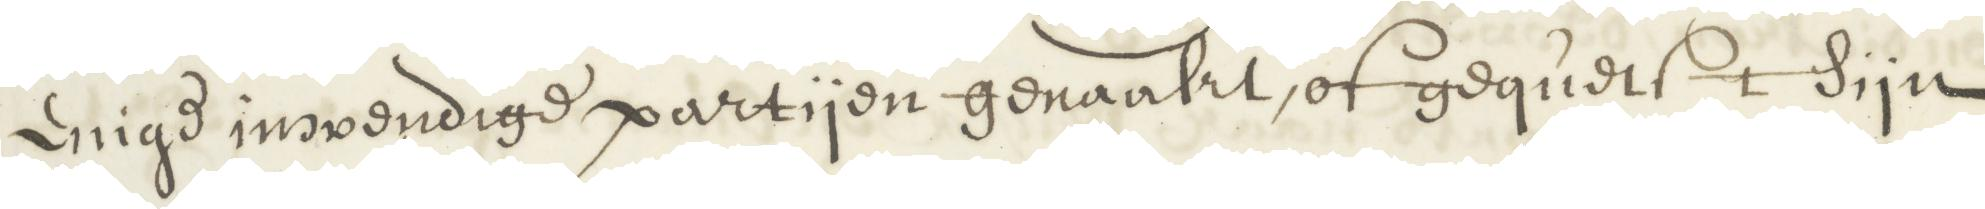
enige inwendige partijen geraakt, of gequetst sijn
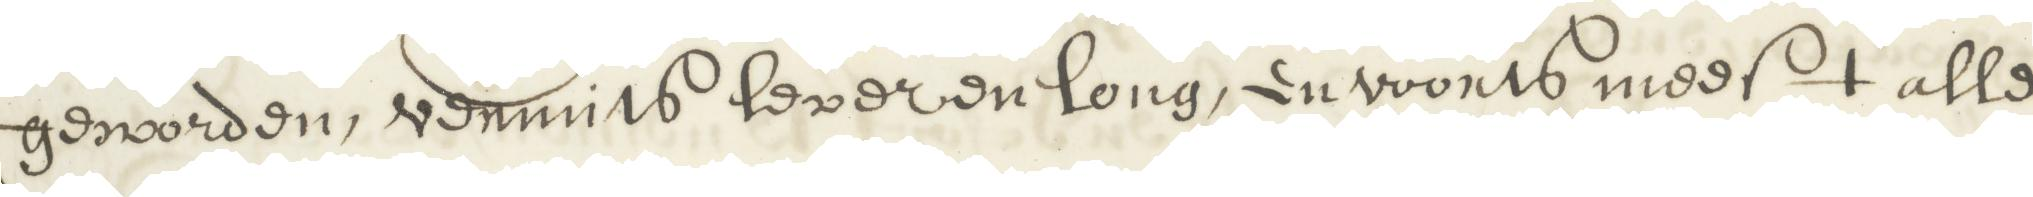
geworden, vermits lever en long, en voorts meest alle
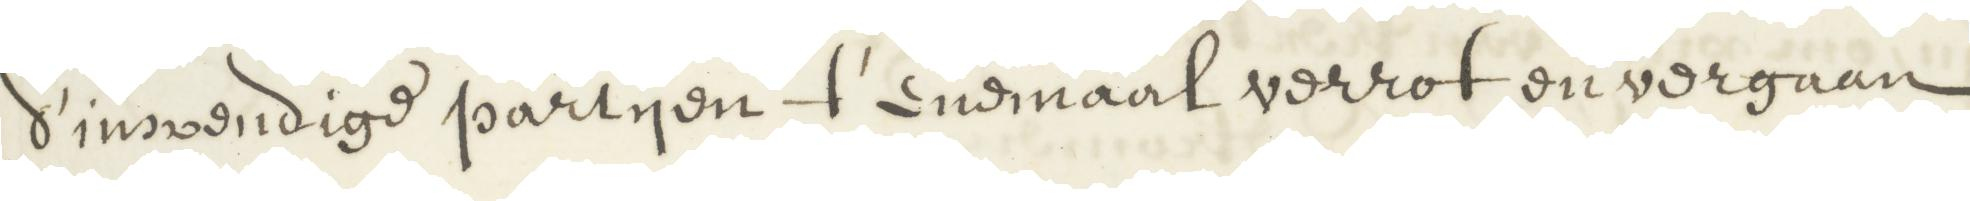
d’ inwendige partijen t' enemaal verrot en vergaan
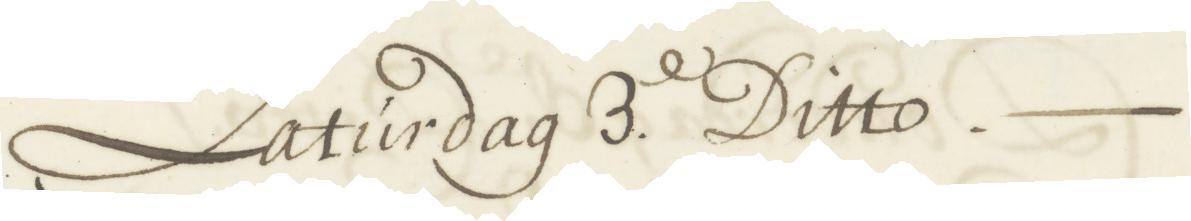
Zaturdag 3.e Ditto. —
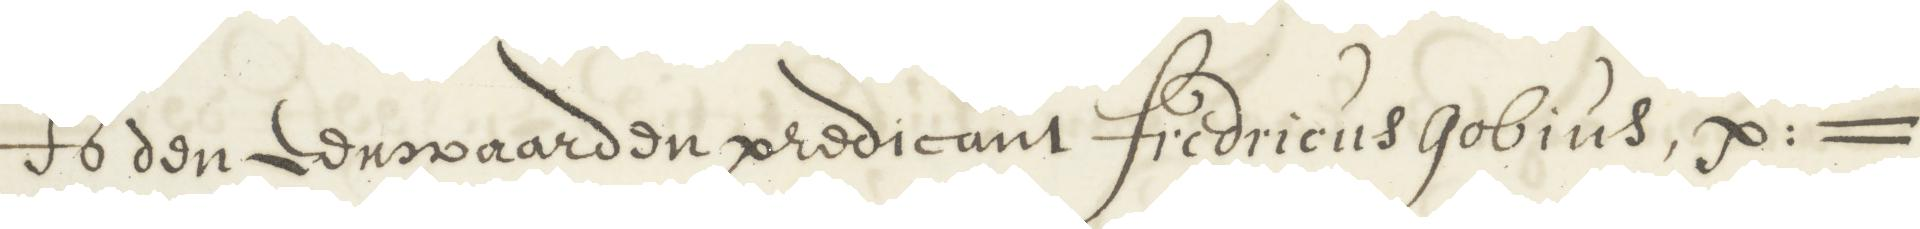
Is den eerwaarden predicant fredricus gobius, p:=r
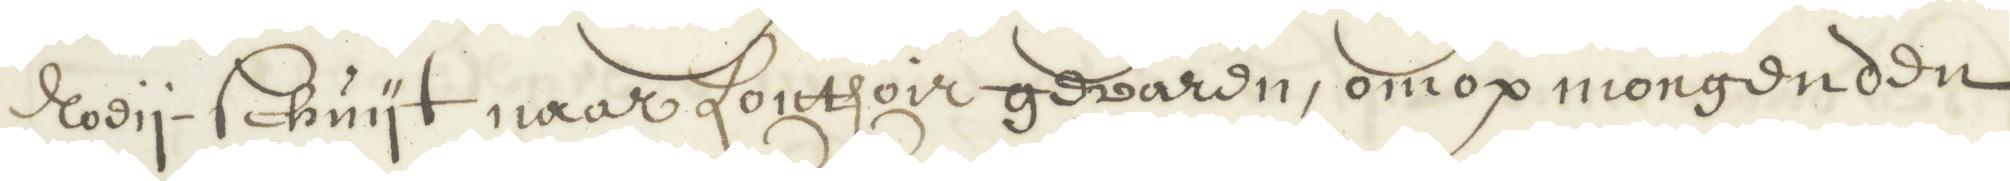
roeij-schuijt naar Lonthoir gevaren, om op morgen den
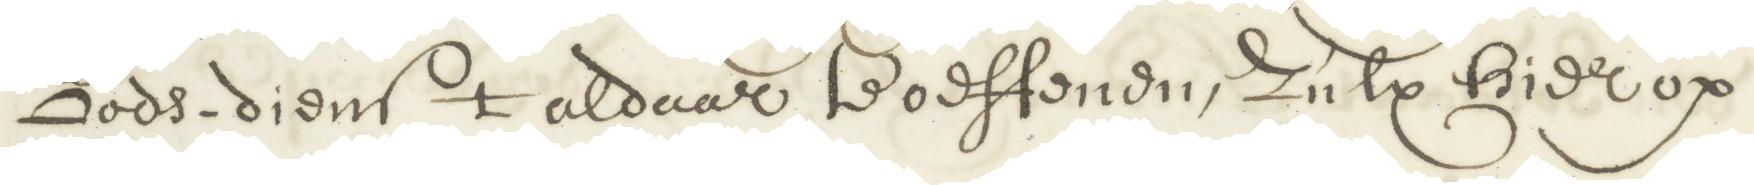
gods-dienst aldaar te oeffenen, zulx hier op
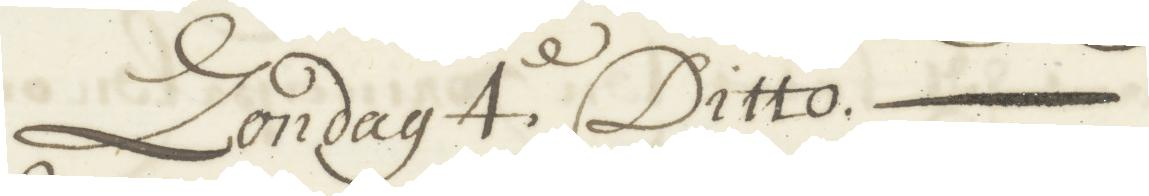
Zondag 4„e Ditto. —
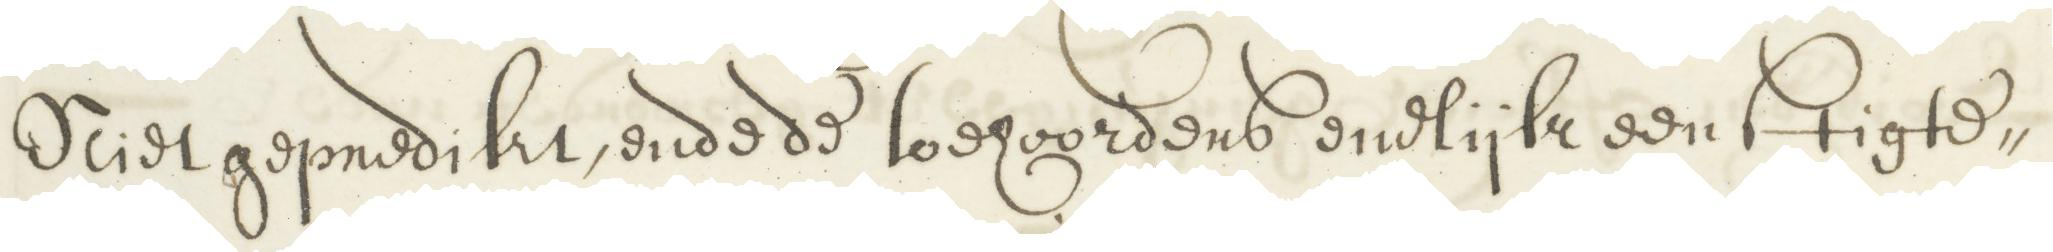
Niet gepredikt, ende de toehoordens enelijk een stigte„
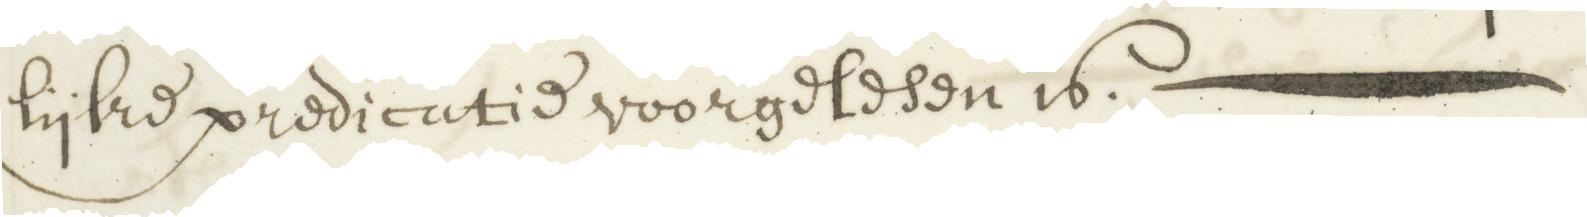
lijke predicatie voorgelesen is. —
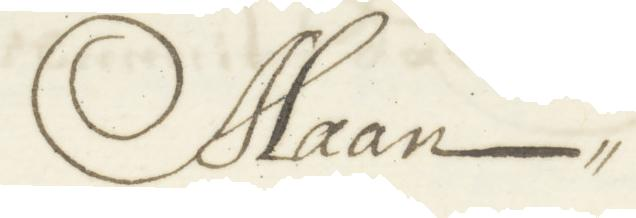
Haan„
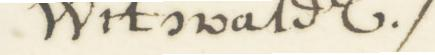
Witwater./
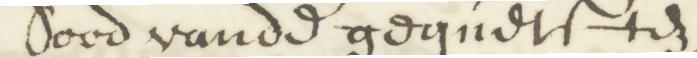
dood van de gequetsten
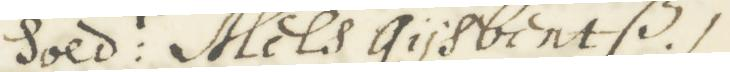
sold:t Mels gijsbertsz./
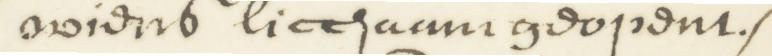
wiens licchaam geopent./
